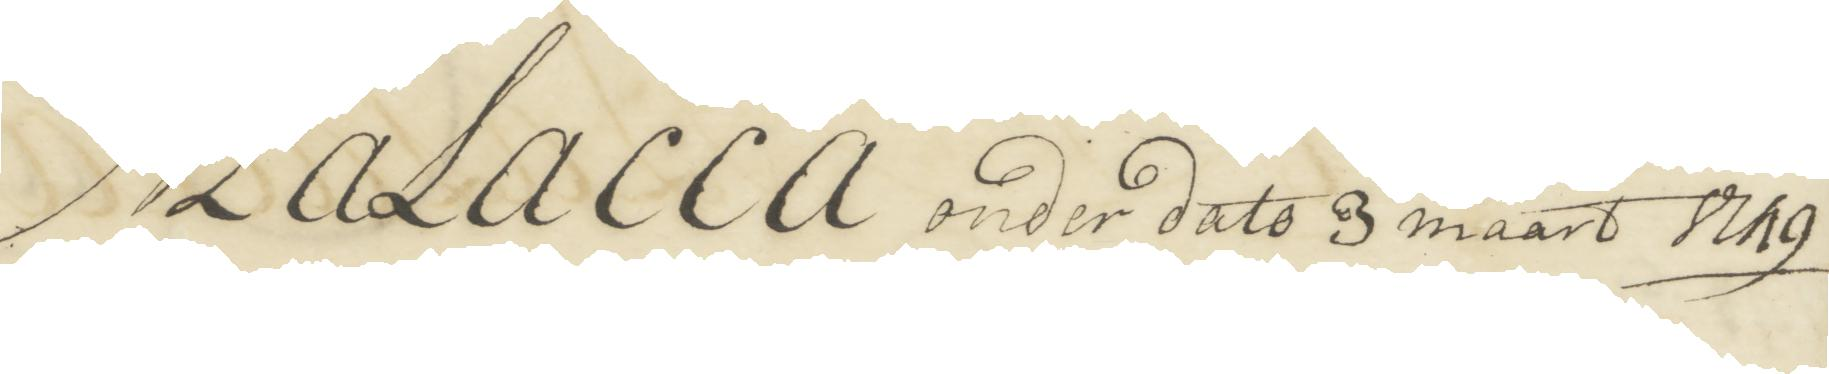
Van Malacca onder dato 3 maart 1749
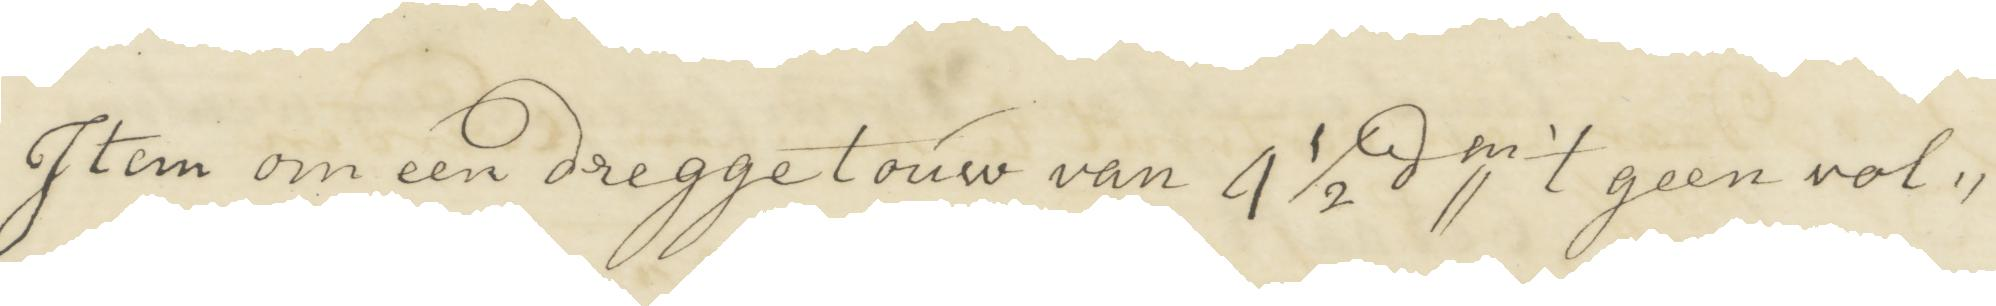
Jtem om een dreggetouw van 4½ d„m ’t geen vol„
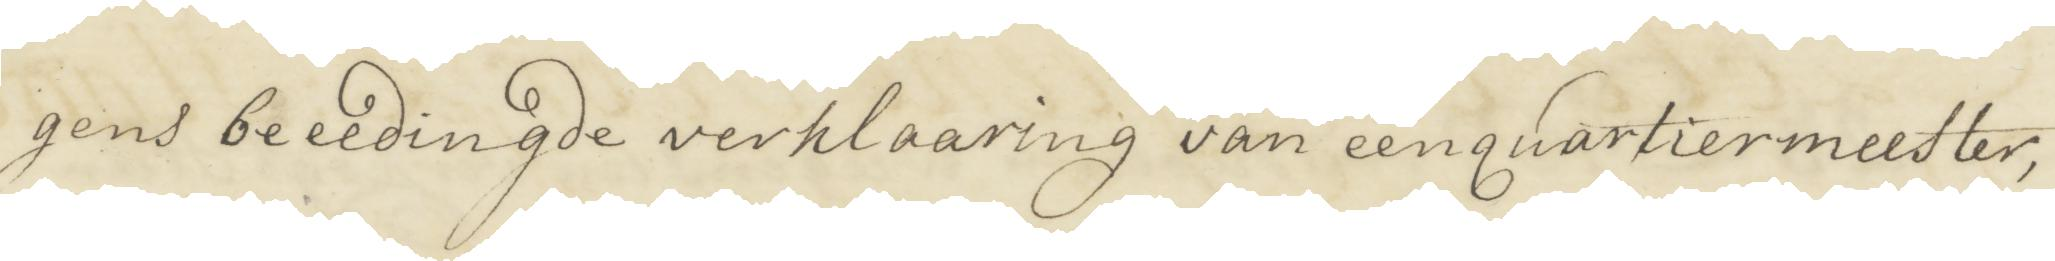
gens beeedingde verklaaring van een quartiermeester,
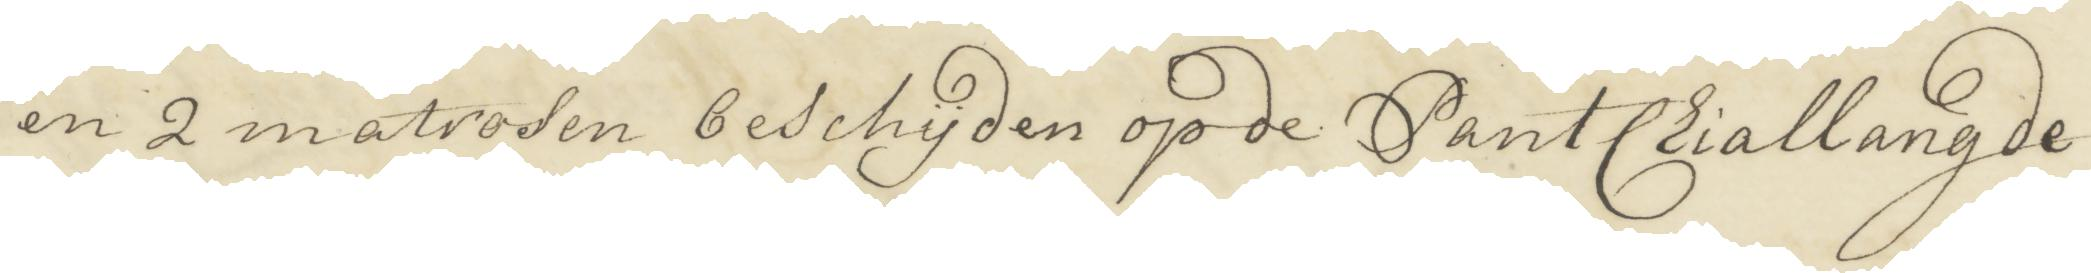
en 2 matrosen beschijden op de Pantchiallang de
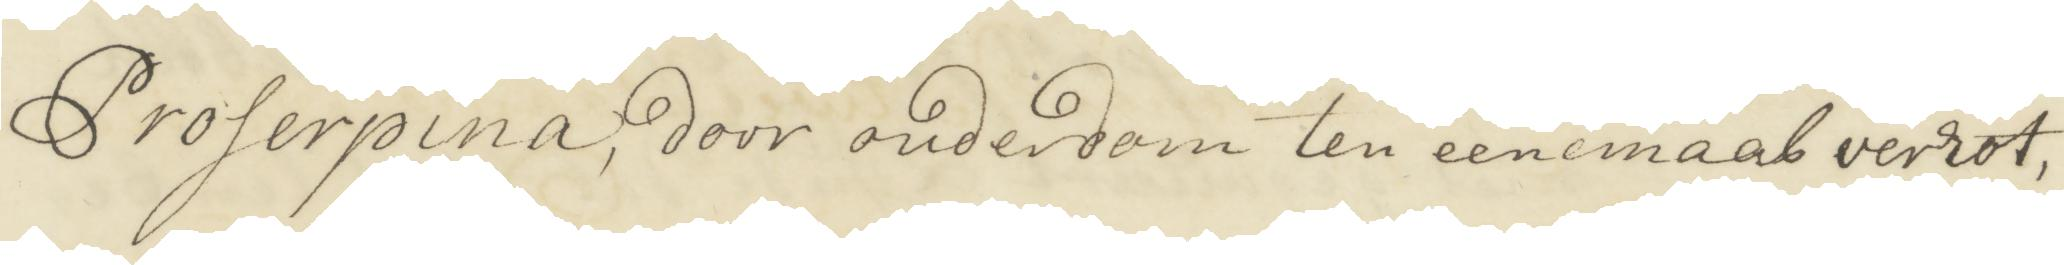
Proserpina, door ouderdom ten eenemaal verrot,
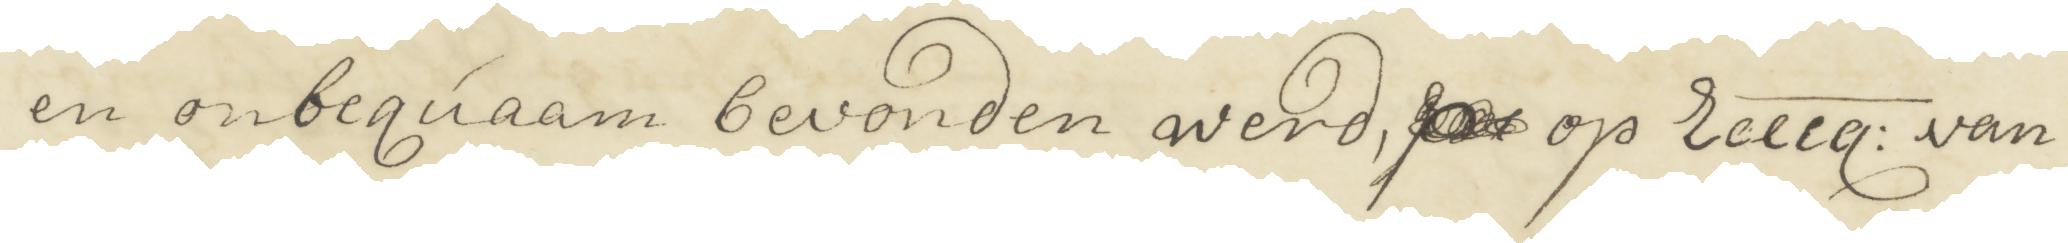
en onbequaam bevonden werd, pt op reecq: van
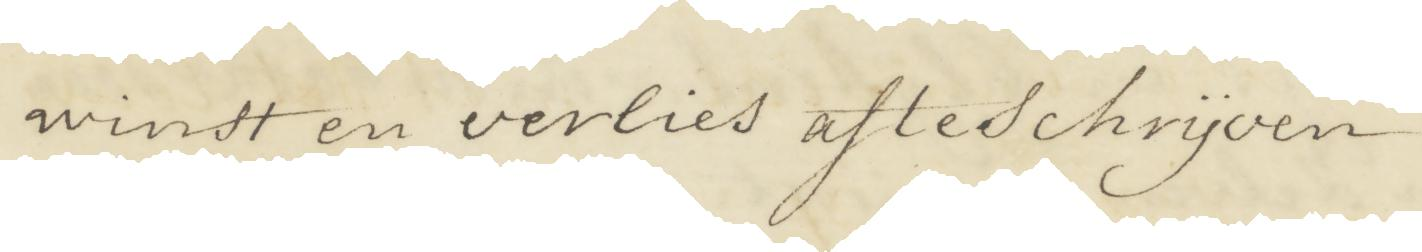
winst en verlies afteschrijven
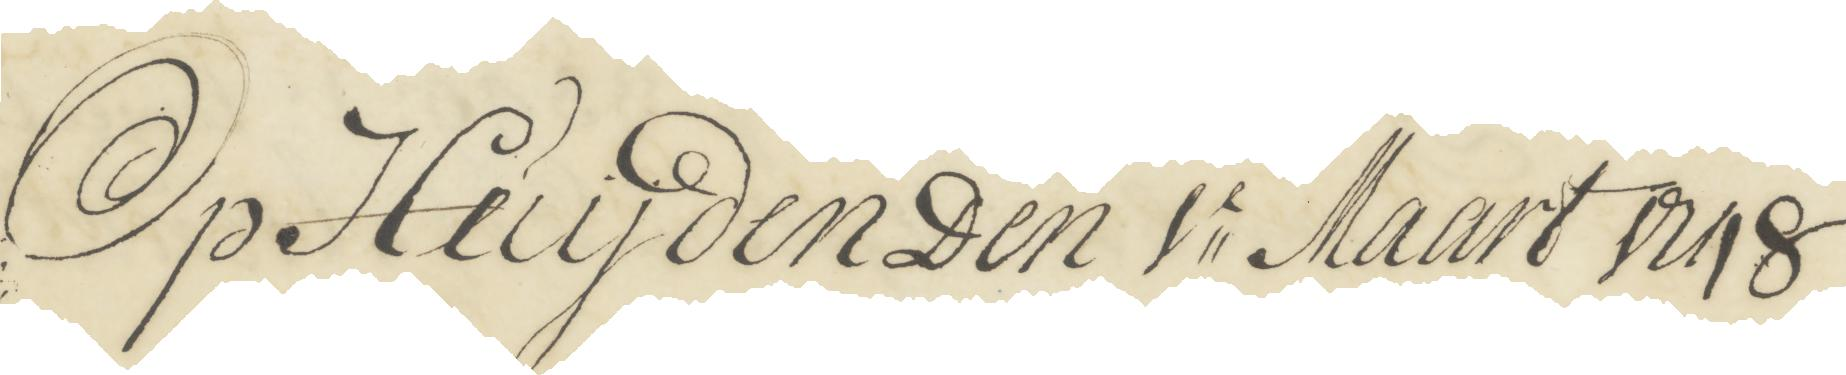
Op Huijden Den 1„e Maart 1748
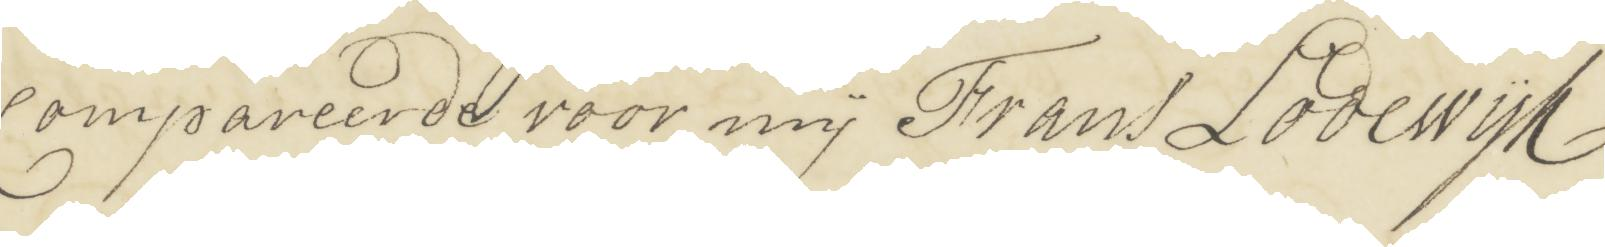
Compareerde voor mij Frans Lodewijk
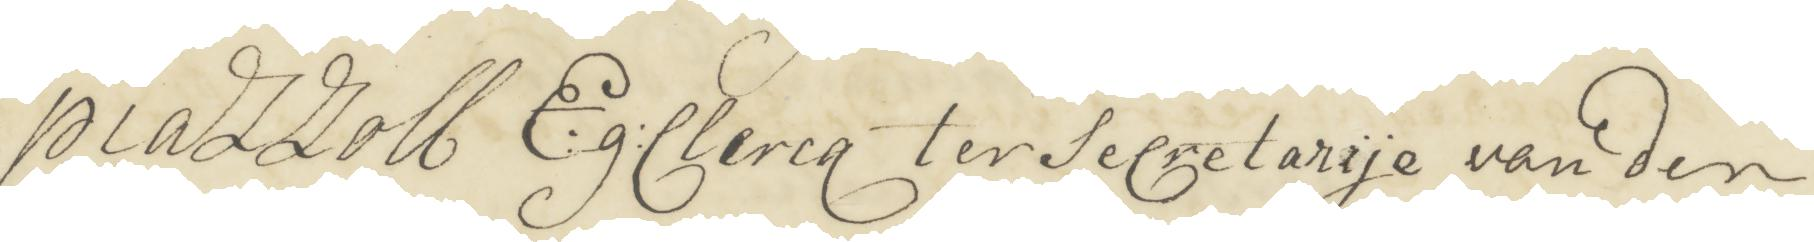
piazzoll E:g: Clercq ter secretarije van den
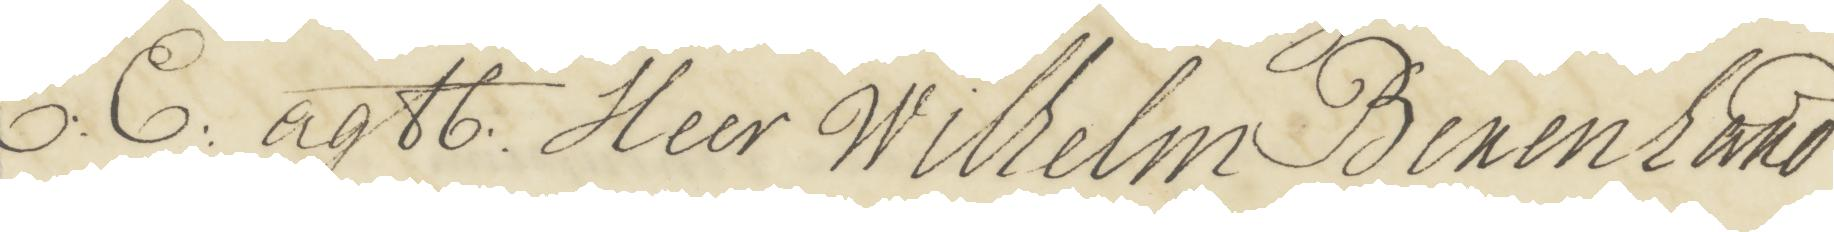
E:E: agtb: Heer Wilhelm Berenhard
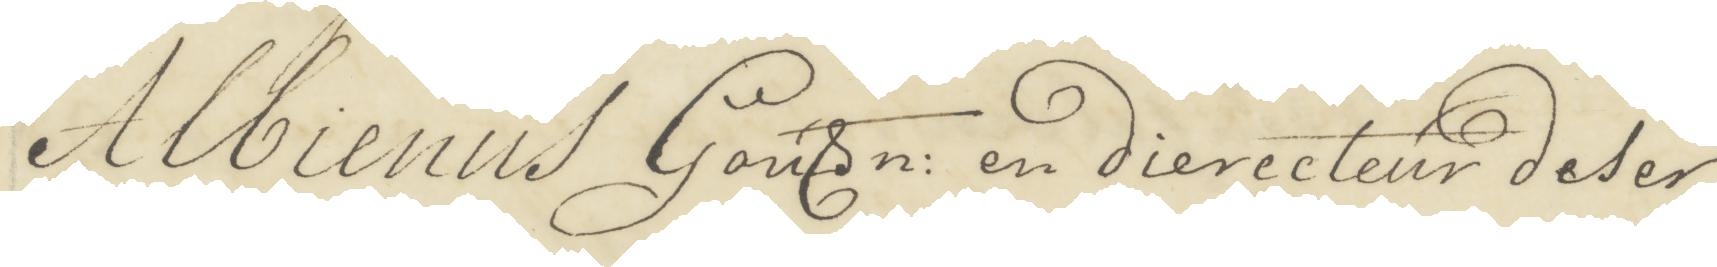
Albienus Gouvern: en dierecteur deser
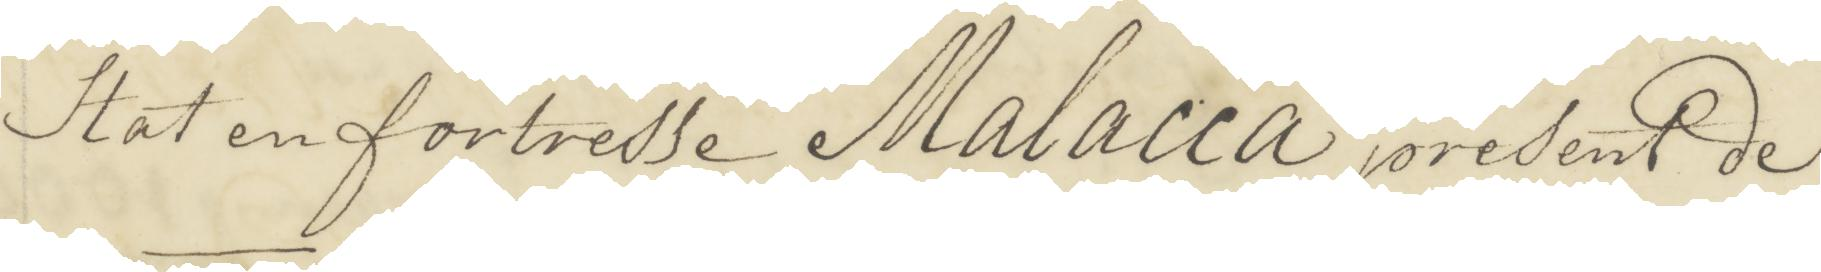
stat en fortresse Malacca present de
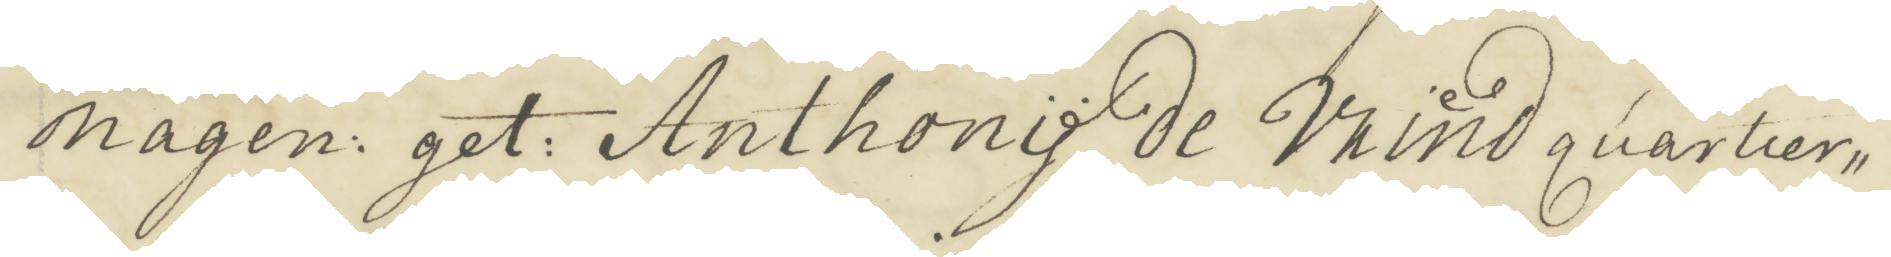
nagen: get: Anthonij de Vriend quartier„
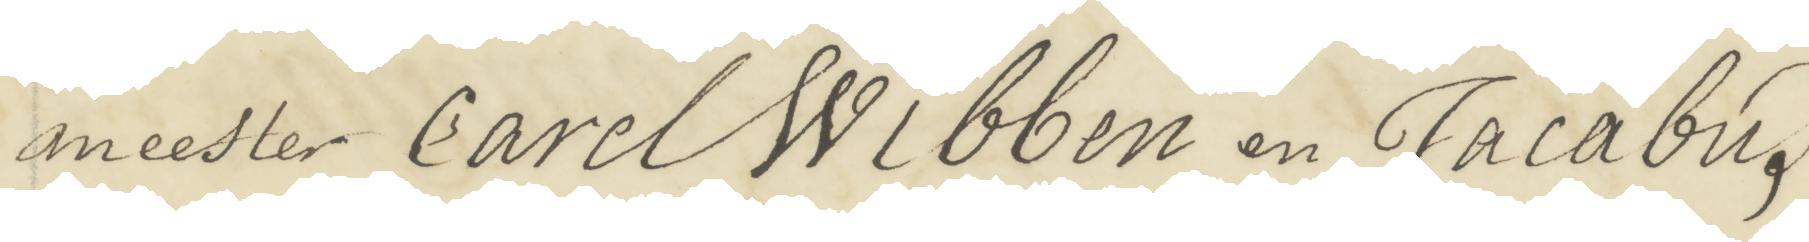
meester Carel Wibben en Jacabus
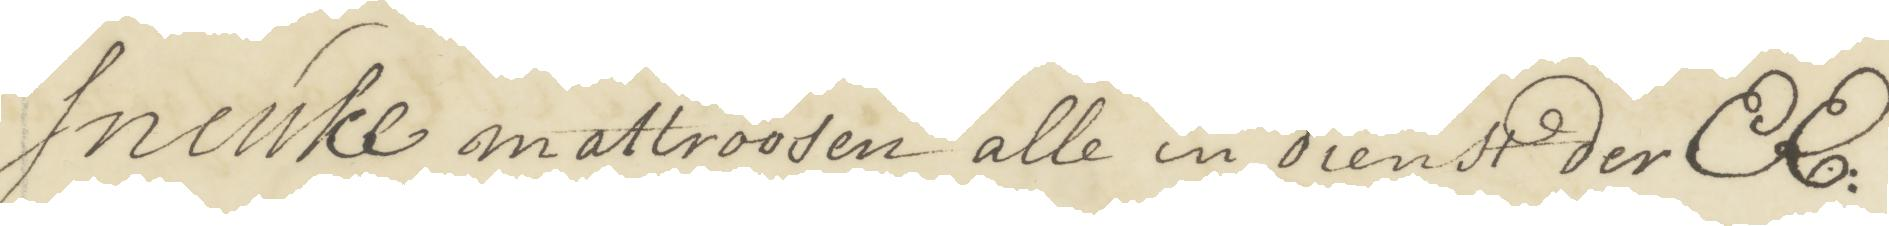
Sneuke mattroosen alle in dienst der EE:
